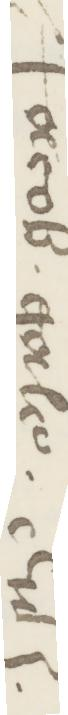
Jacob . gale . ensz.
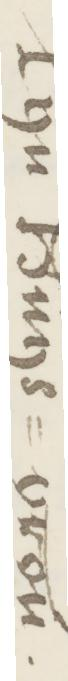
sijn huijs=vrou .
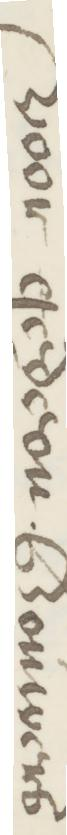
voor gedeon . Bouwers
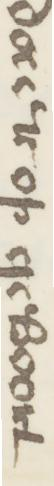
daer op gehoort
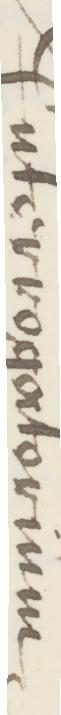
Jnterrogatorium
